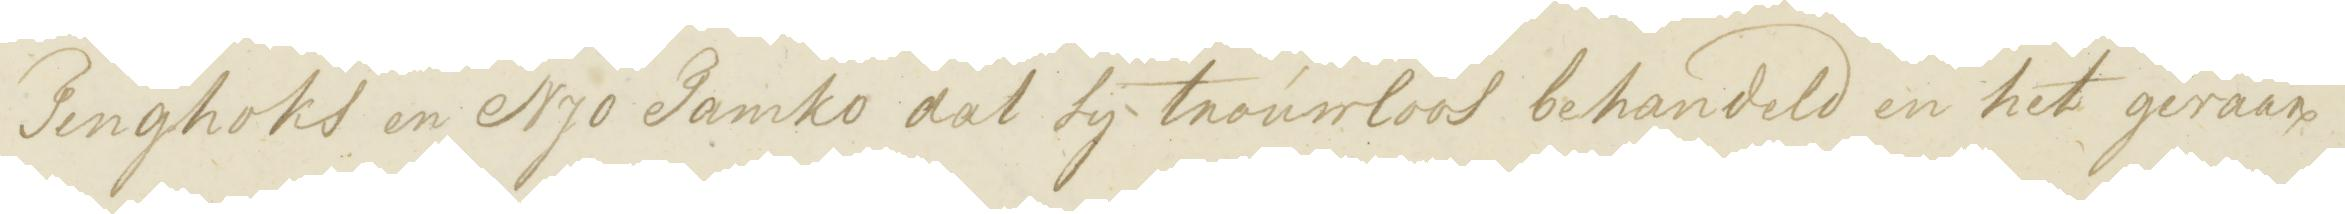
Tenghoks en Njo Tamko dat sij trouwloos behandeld en het gevaar
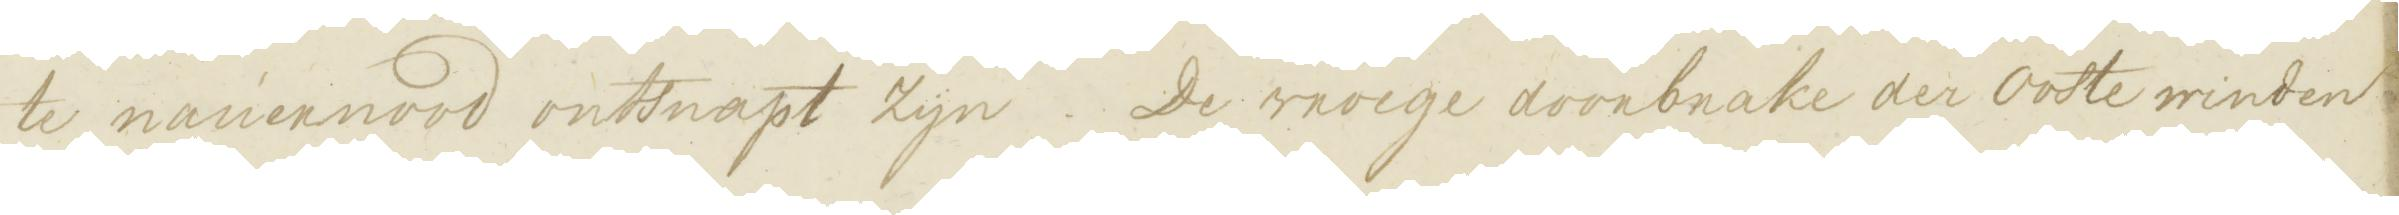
te nauernood ontsnapt zijn. De vroege doorbrake der Ooste winden
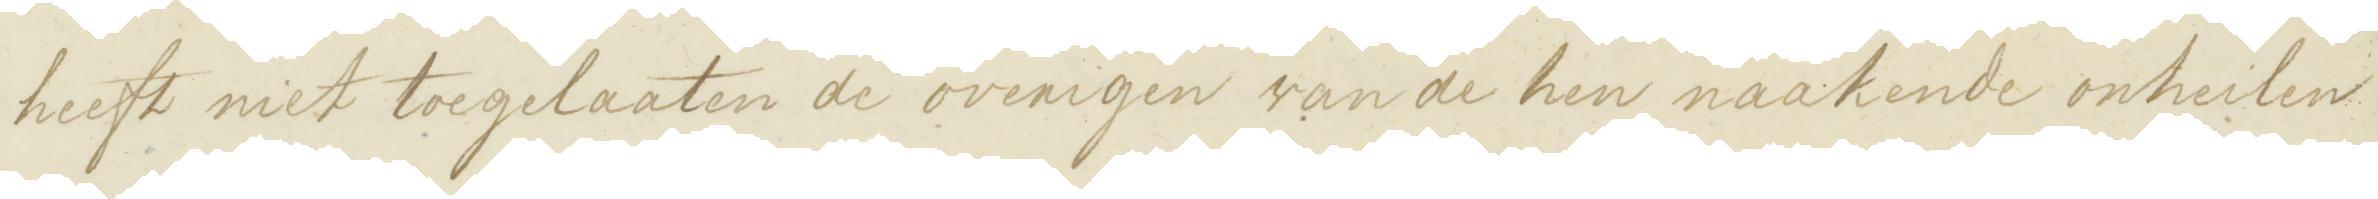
heeft niet toegelaaten de overigen van de hen naakende onheilen
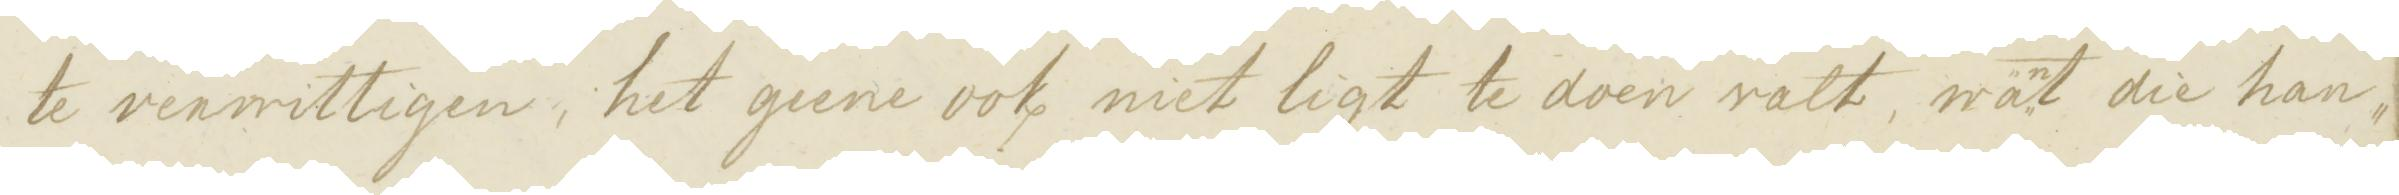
te verwittigen; het geene ook niet ligt te doen valt, wa„„nt die han„
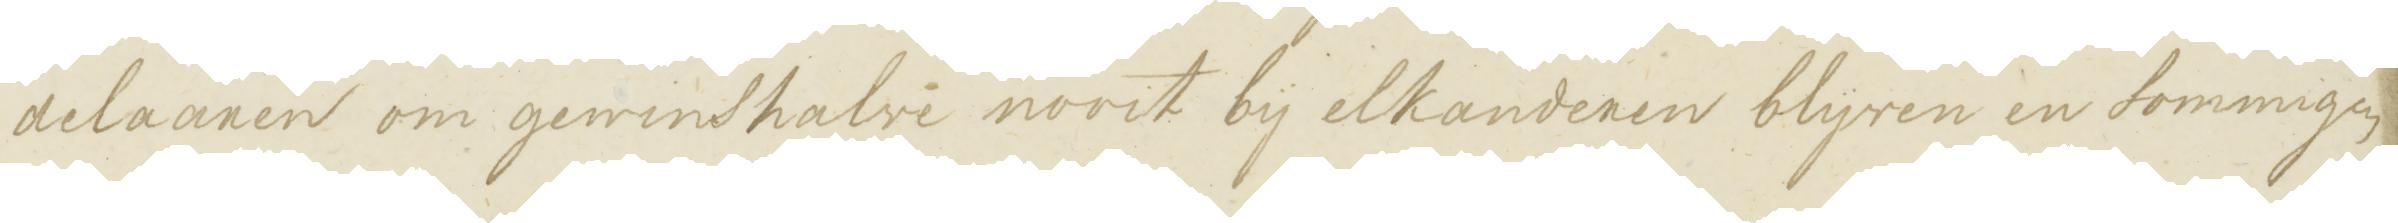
delaaren om gewinshalve nooit bij elkanderen blijven en sommigen
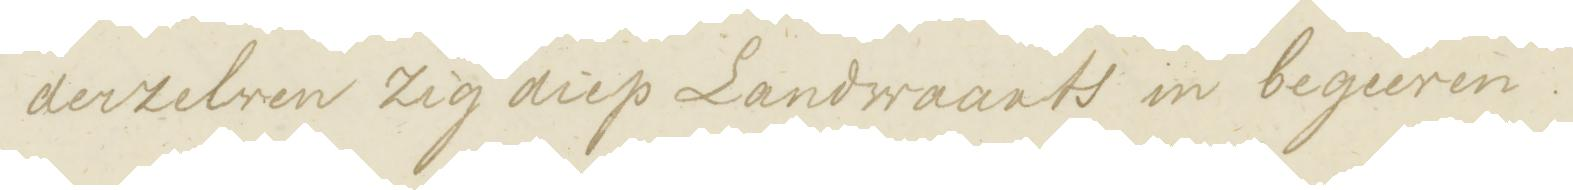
derzelven zig diep Landwaarts in begeeven.
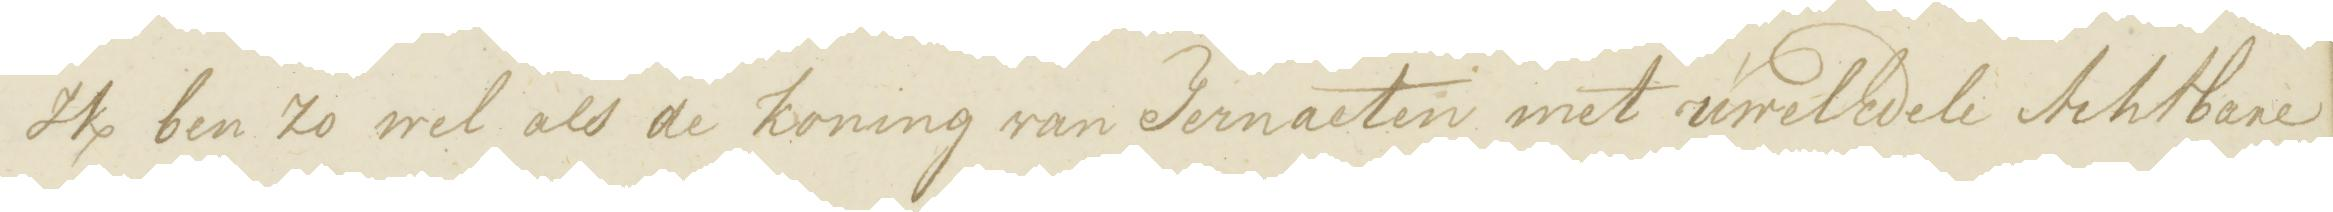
Ik ben zo wel als de koning van Ternaeten met uwel Edele Achtbare
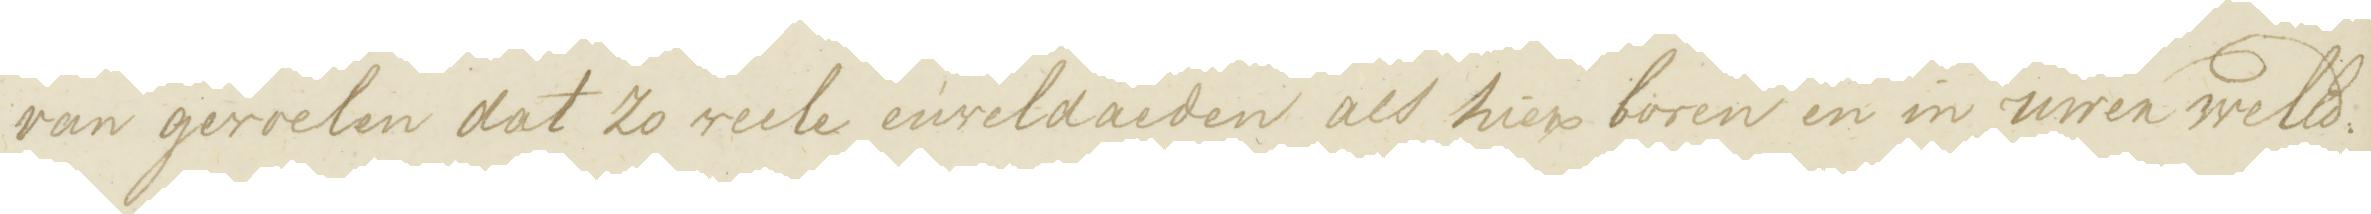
van gevoelen dat zo veele euveldaeden als hier boven en in uwer welEd:
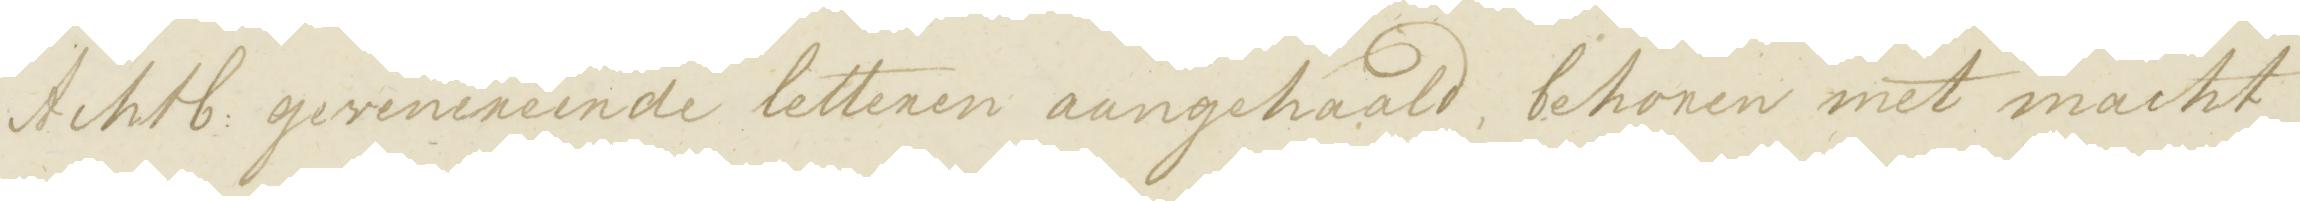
Achtb: gevenereerde letteren aangehaald, behoren met macht
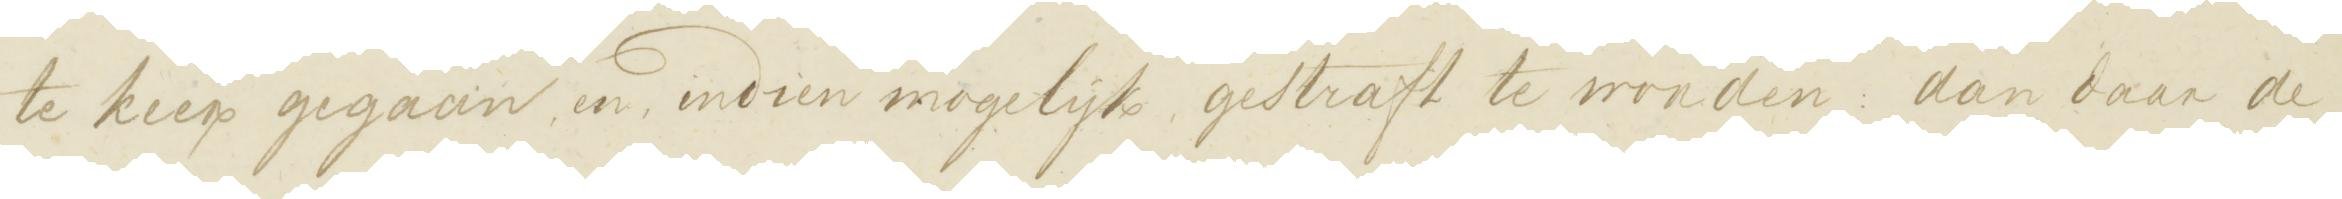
te keer gegaan, en, indien mogelijk, gestraft te worden: dan daar de
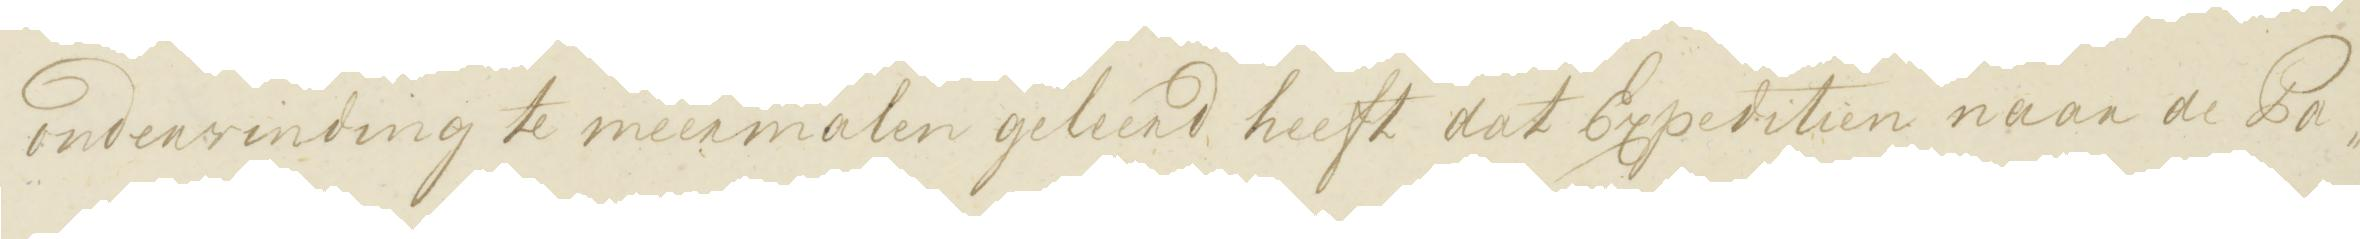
ondervinding te meermalen geleerd heeft dat Expeditien naar de Pa
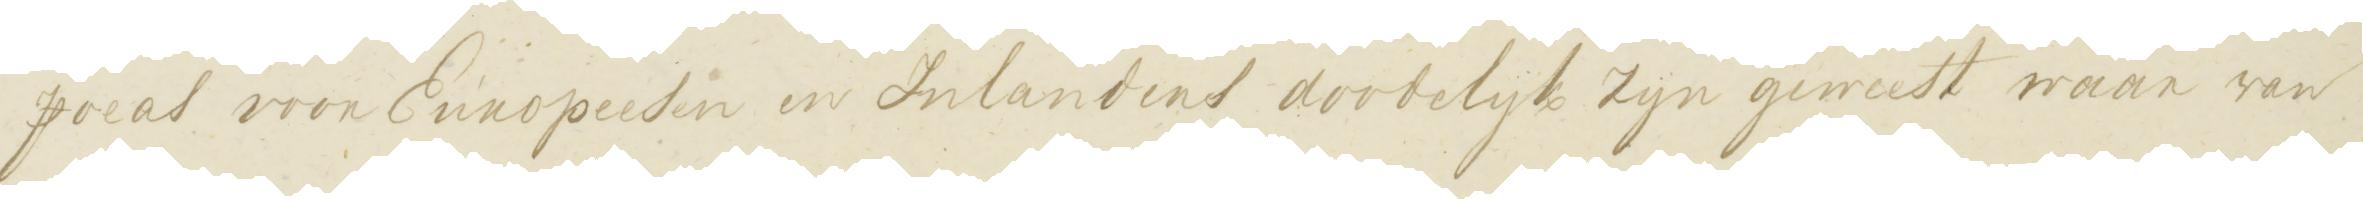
poeas voor Europeesen en Inlanders doodelijk zijn geweest waar van
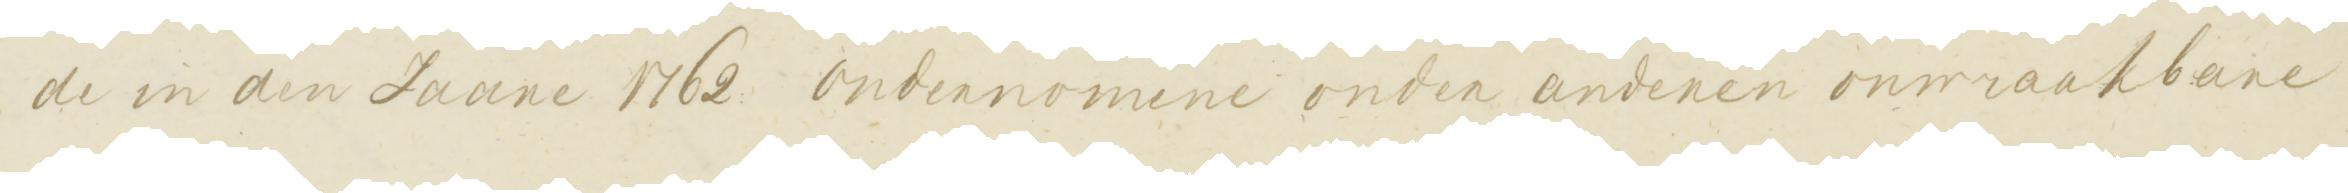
de in den Iaare 1762: ondernomene onder anderen onwraakbare
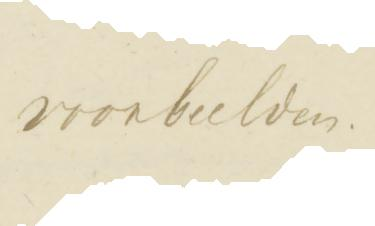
voorbeelden.
